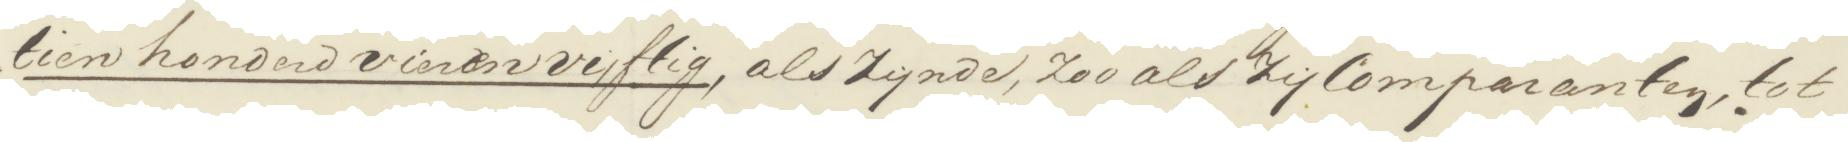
tien honderd vier en vijftig, als zijnde, zoo als zij comparanten, tot
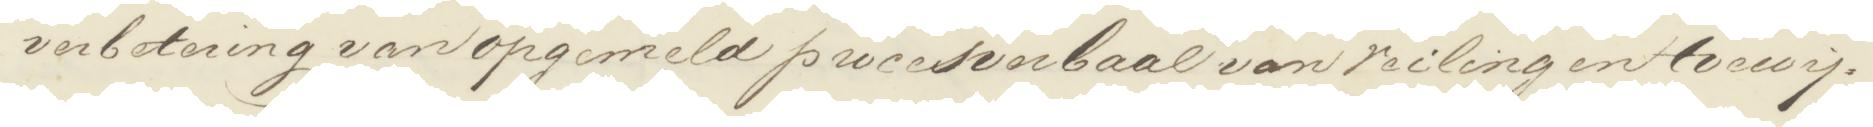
verbetering van opgemeld procesverbaal van veiling en toewij=
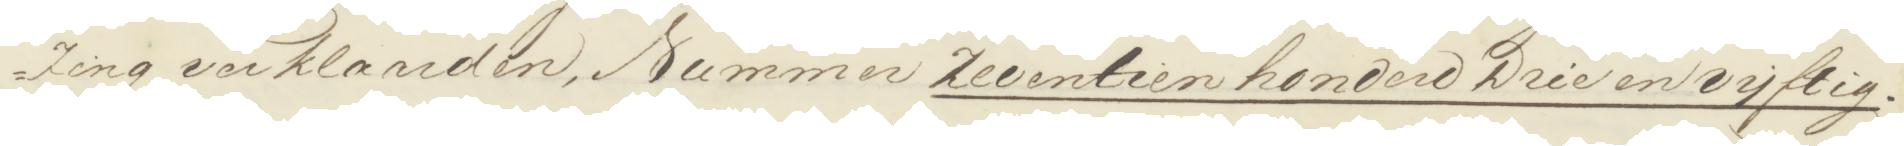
=zing verklaarden, Nummer Zeventien honderd Drie en vijftig.
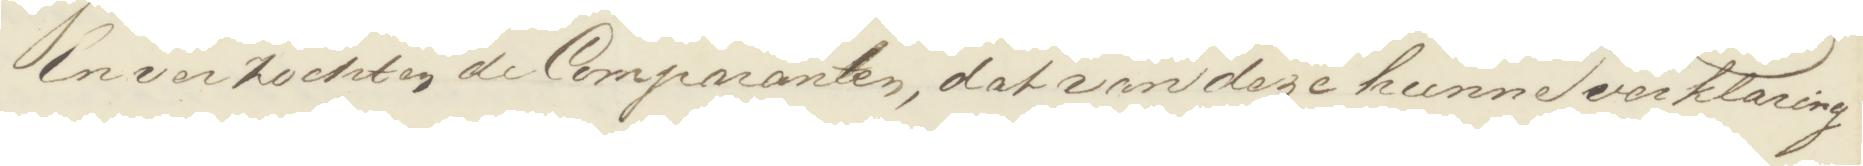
En verzochten de Comparanten, dat van deze hunne verklaring
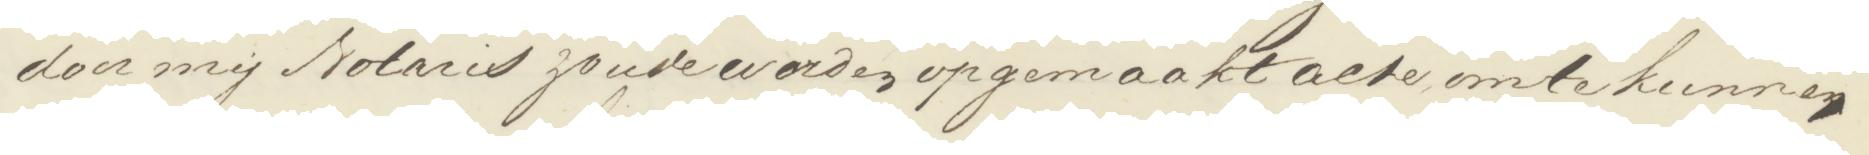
door mij Notaris zoude worden opgemaakt acte, om te kunnen
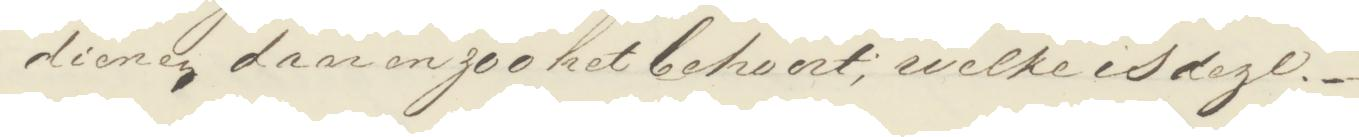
dienen daar en zoo het behoort; welke is deze. –
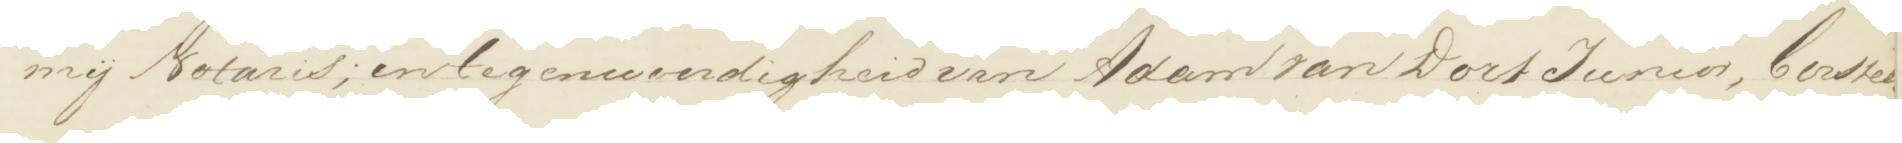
mij Notaris; en tegenwoordigheid van Adam van Dort Iunior, borste
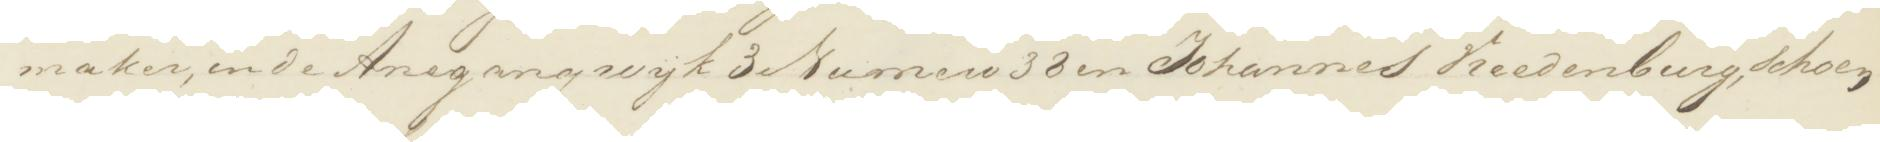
maker, in de Anegang wijk 3 Numero 38 en Iohannes Vreedenburg, schoen
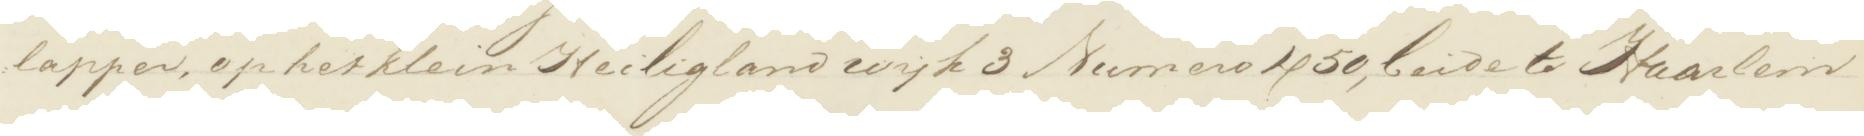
lapper, op het klein Heiligland wijk 3 Numero 450, beide te Haarlem
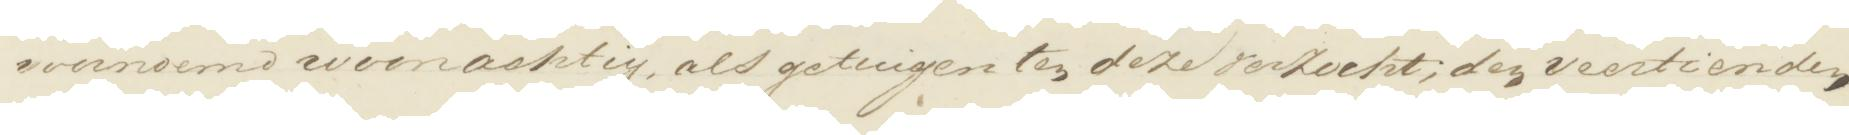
voornoemd woonachtig, als getuigen ten deze verzocht; den veertienden
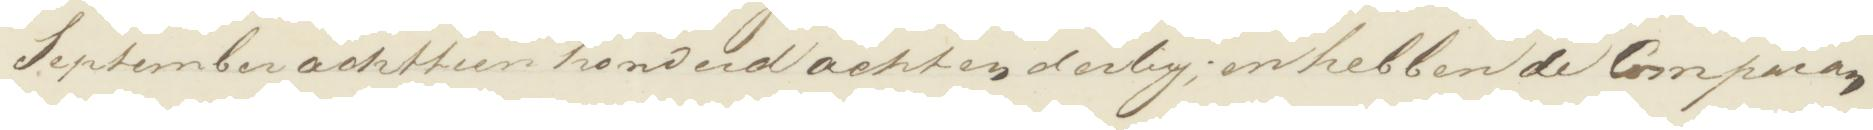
September achttienhonderd acht en dertig, en hebben de Comparan
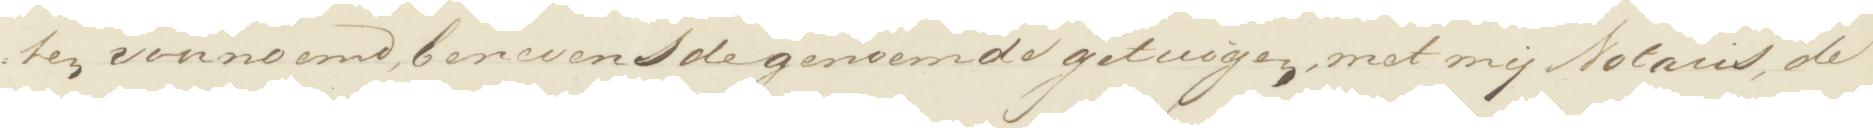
ten voornoemd, benevens de genoemde getuigen, met mij Notaris, de
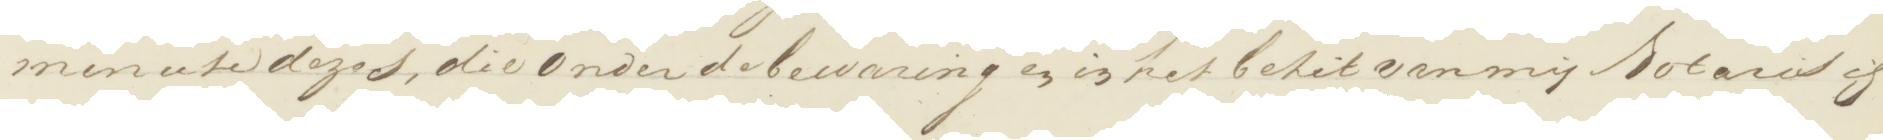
minute dezes, die onder de bewaring en in het bezit van mij Notaris is
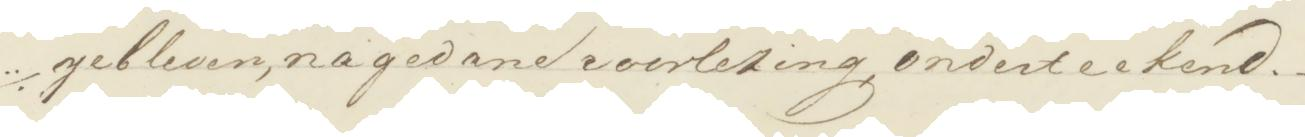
gebleven, nagedane voorlezing, onderteekend.
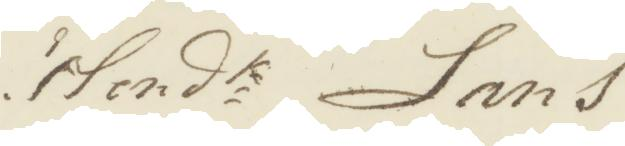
Hend=k Lans
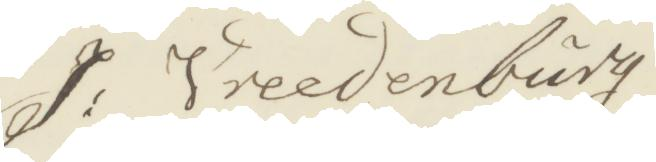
J: Vreedenburg
